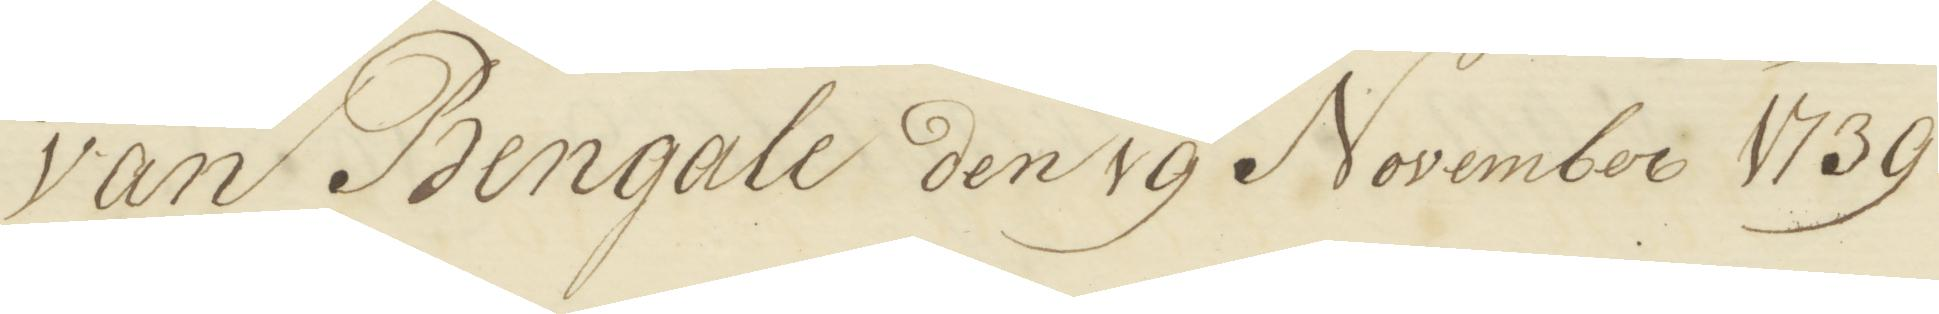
Van Bengale den 19 November 1739
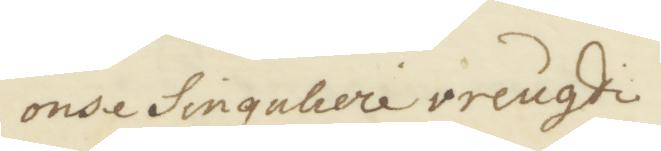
onse singuliere vreugde
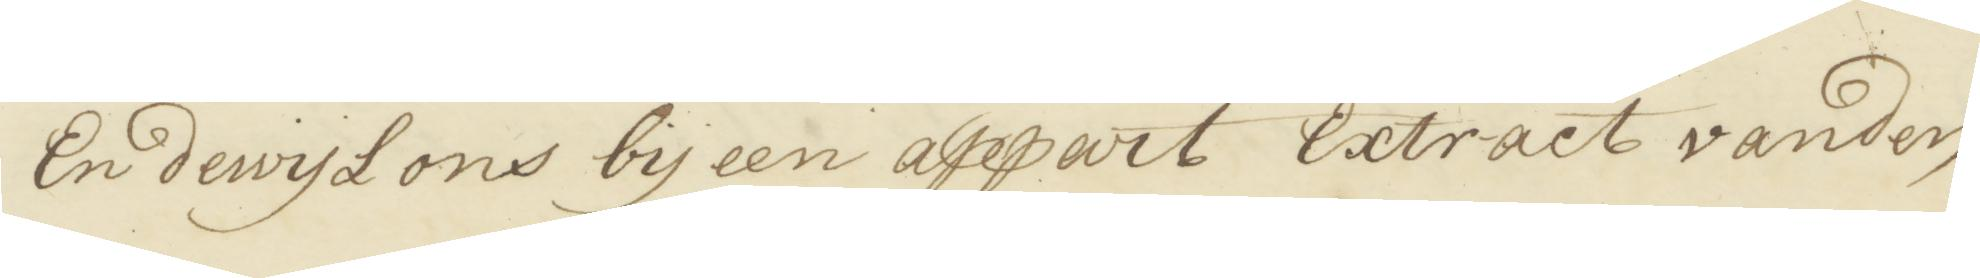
En dewijl ons bij een appart Extract vanden
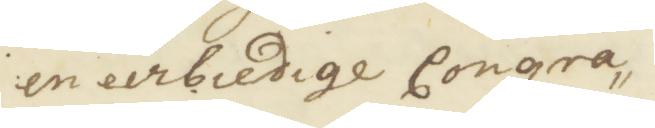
en eerbiedige Congra„
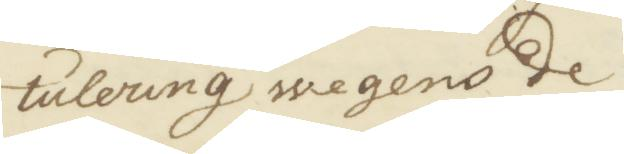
tulering wegens de
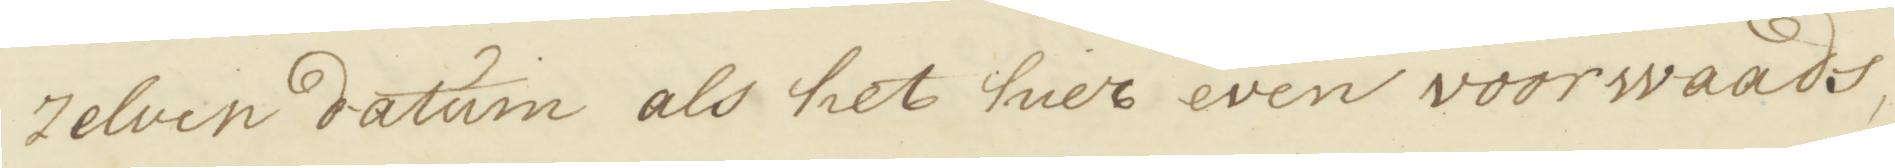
zelven datum als het hier even voorwaads,
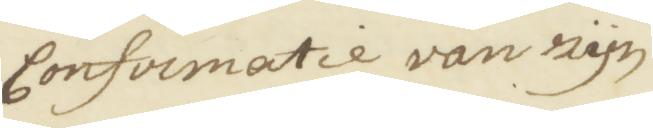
Conformatie van zijn
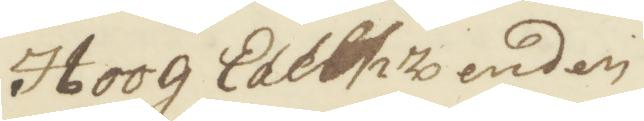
Hoog Edelhz enden
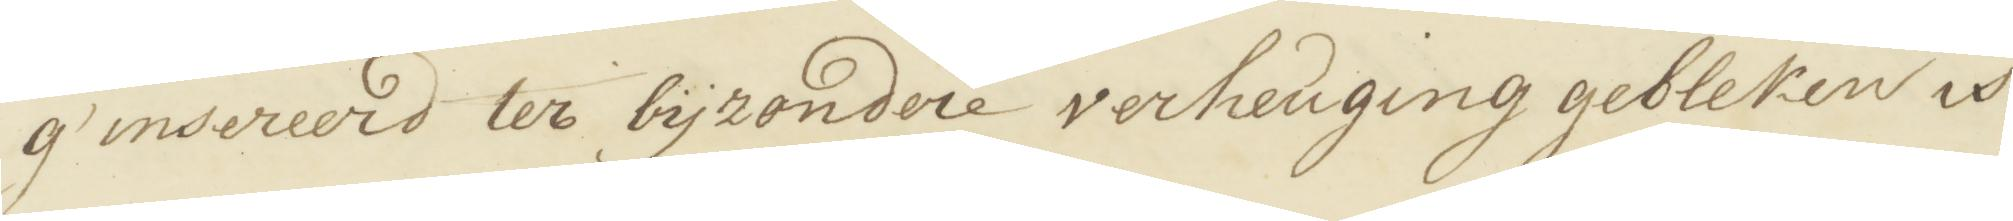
g’insereerd ter bijzondere verheuging gebleken is
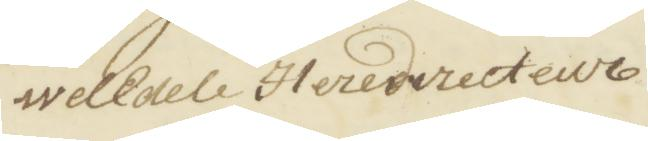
welEdele Heredirecteur
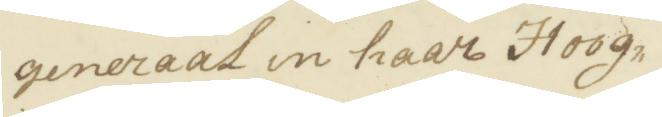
generaal in haar Hoog
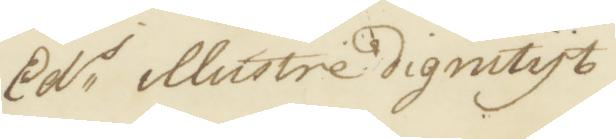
Ed„s illustre dignitijt
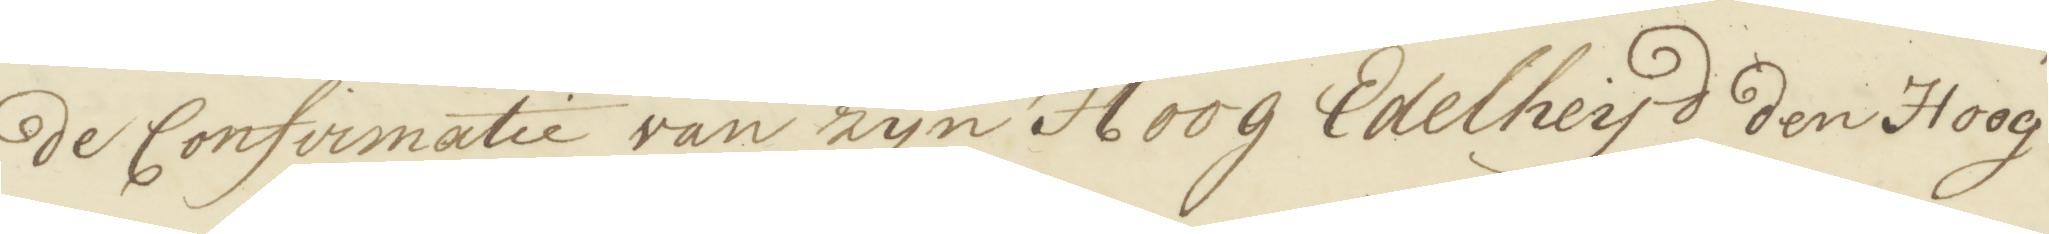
de Confirmatie van zijn Hoog Edelheijd den Hoog
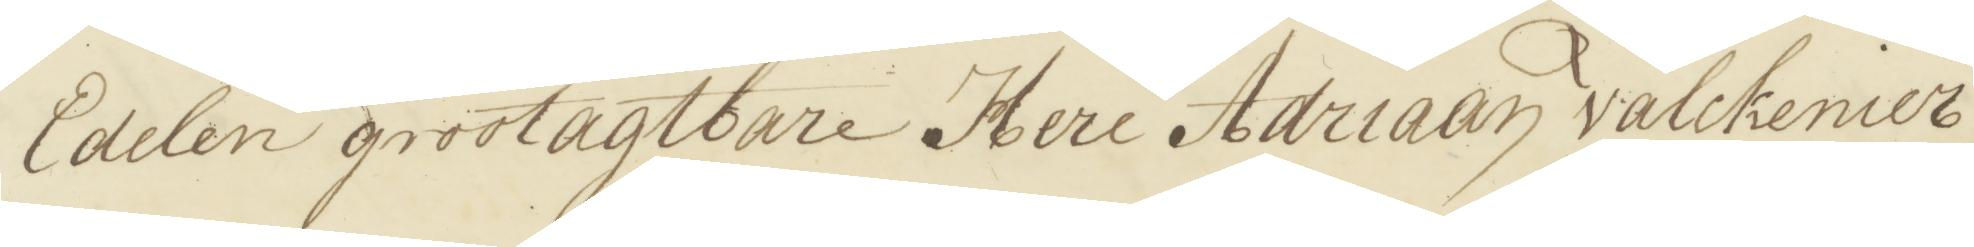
Edelen groot agtbare Here Adriaan Valckenier
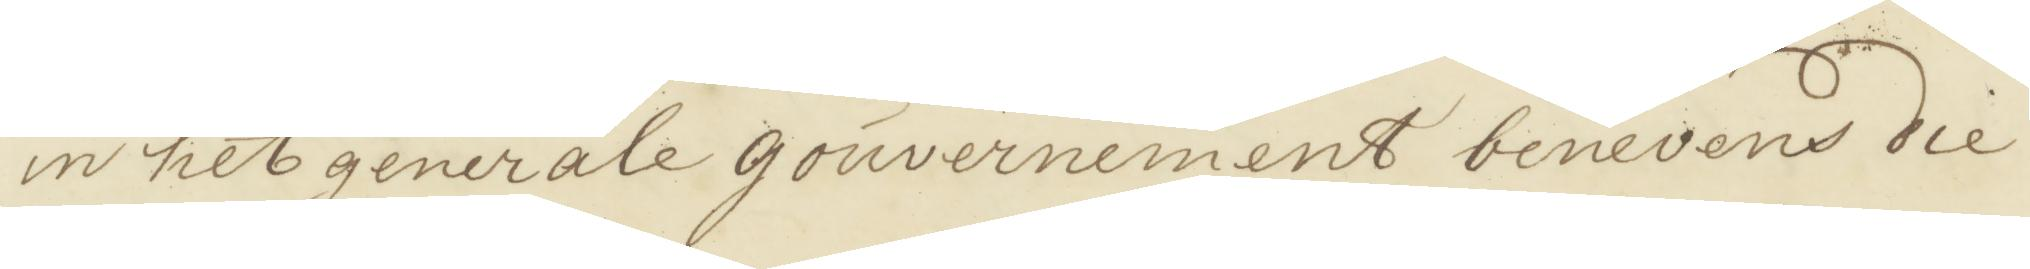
in het generale gouvernement benevens die
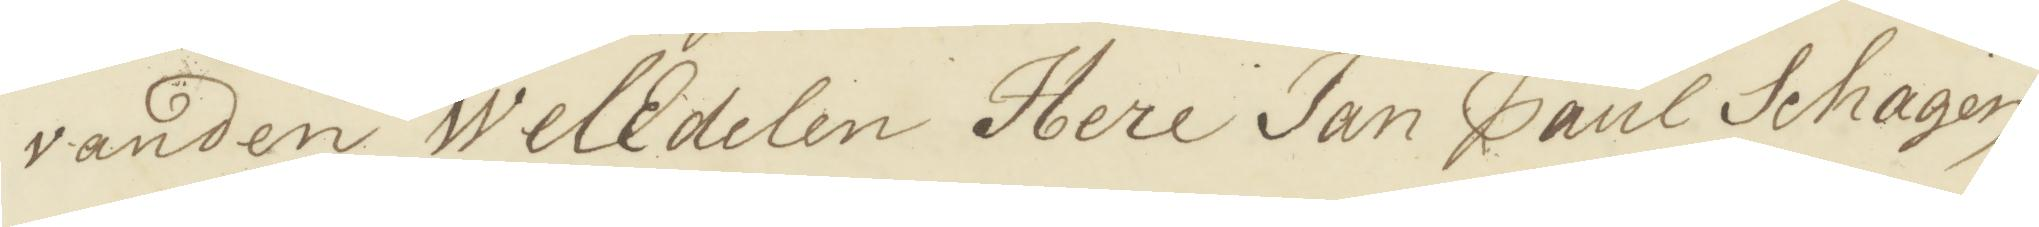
van den WelEdelen Here Jan Paul Schagen
